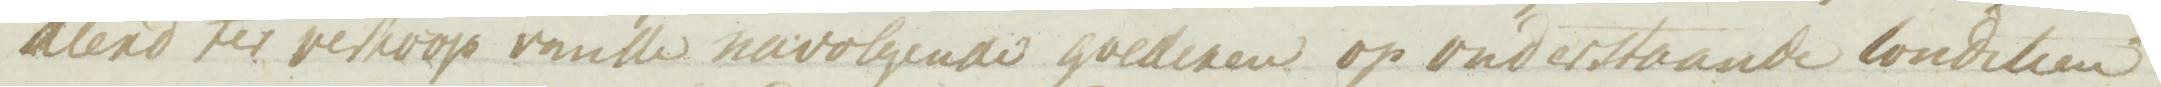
deerd ter verkoop van de navolgende goederen op onderstaande conditien
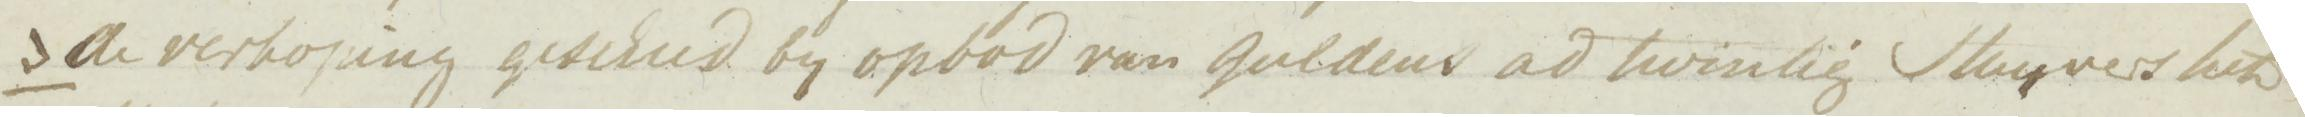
1 de verkoping geschied by opbod van Guldens ad twintig Stuyvers het
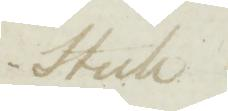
Stuk
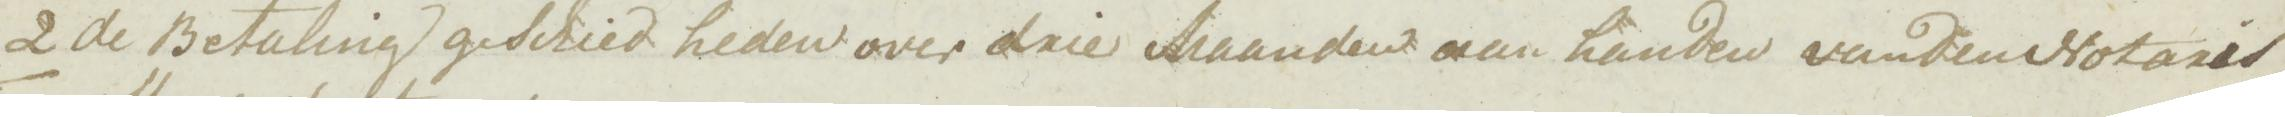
2 de Betaling geschied heden over drie Maanden aan handen van den Notaris
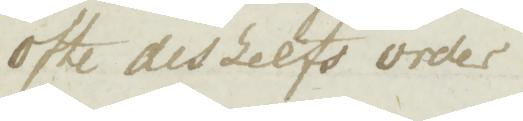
ofte deszelfs order
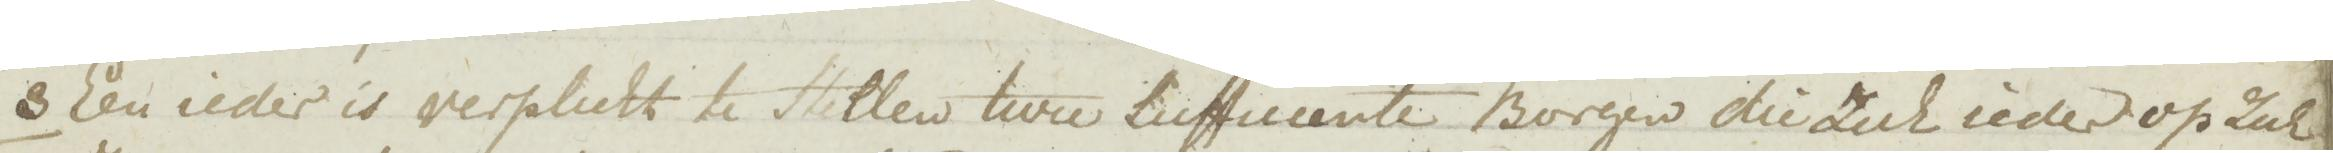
3 Een ieder is verplicht te Stellen twee Sufficiente Borgen die Zich ieder op Zich
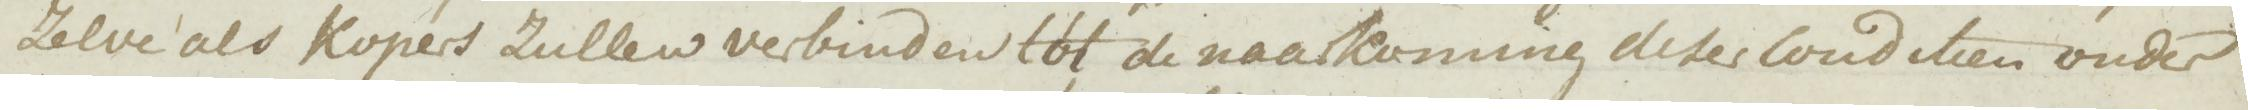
Zelve als kopers Zullen verbinden tot de naarkoming dezer Conditien onder
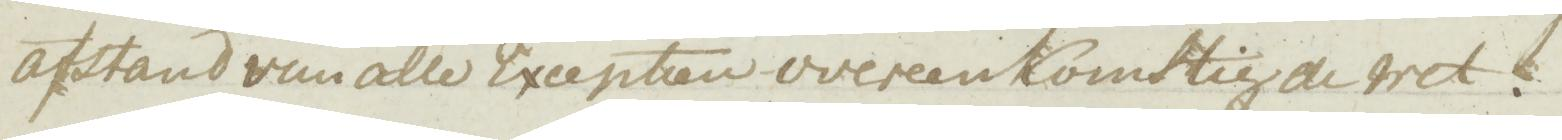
afstand van alle Exceptien overeenkomstig de wet
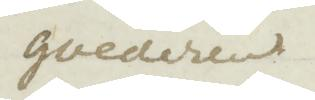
goederen.
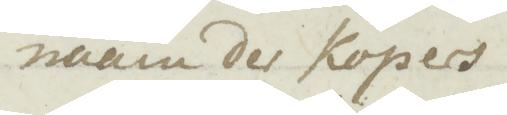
naam der kopers
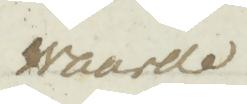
waarde
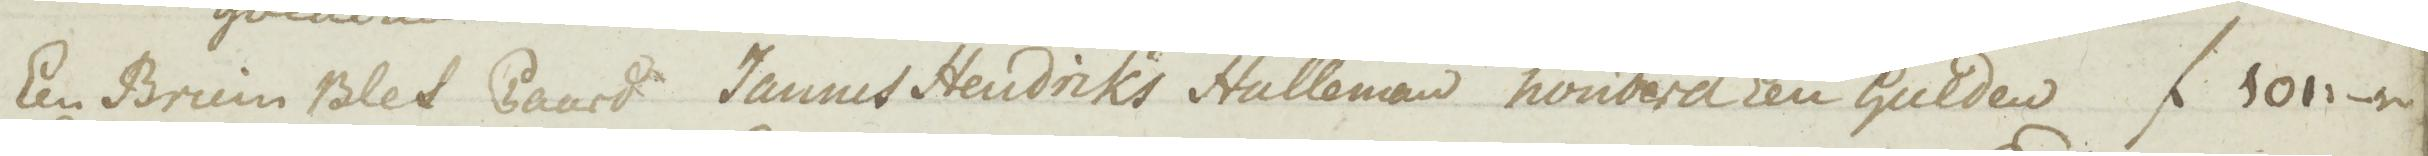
Een Bruin Bles Paard Iannes Hendriks Hulleman honderd Een Gulden ƒ 101:--
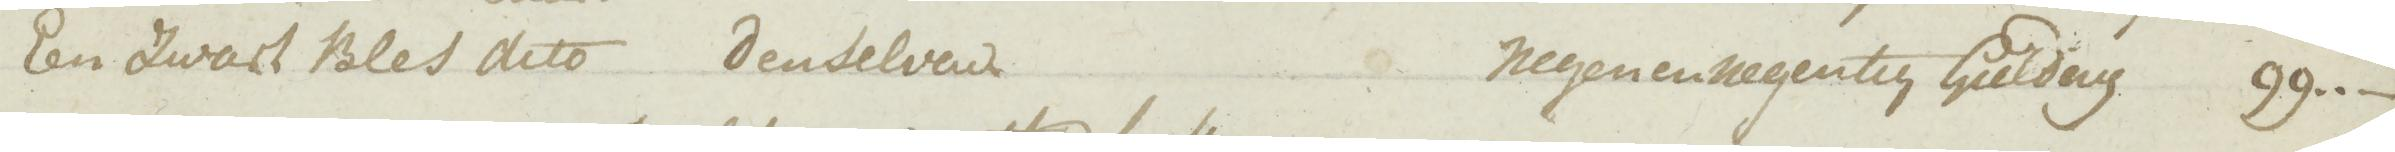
Een Zwart Bles dito denselven negen en negentig Guldens 99.. —
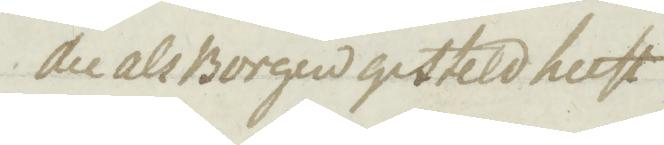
die als Borgen gesteld heeft
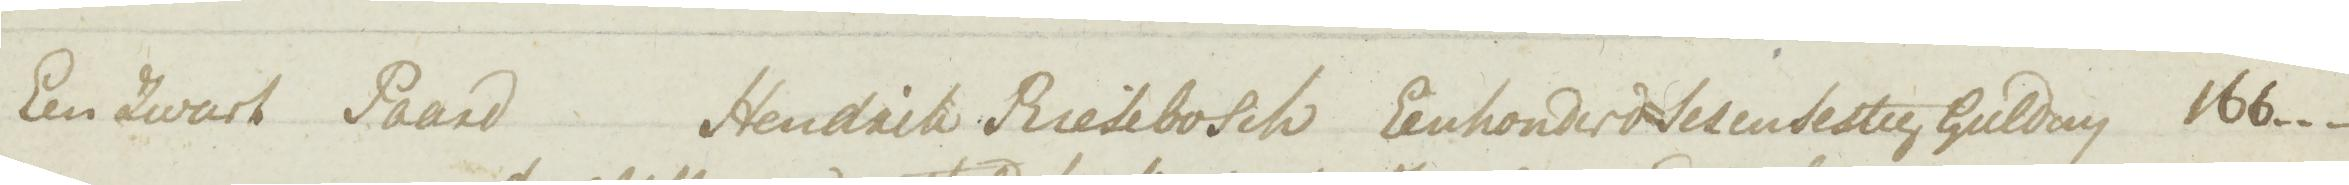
Een Zwart Paard Hendrik Riesebosch Eenhonderd=ses en sestig, Guldens 166- -
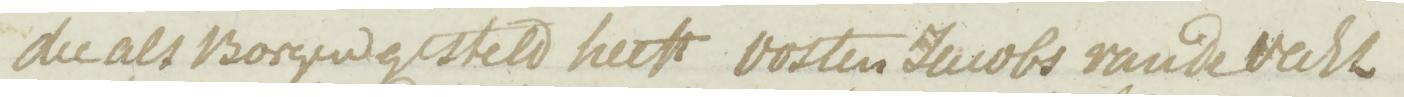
die als Borgen gesteld heeft Oosten Iacobs van de Vecht
